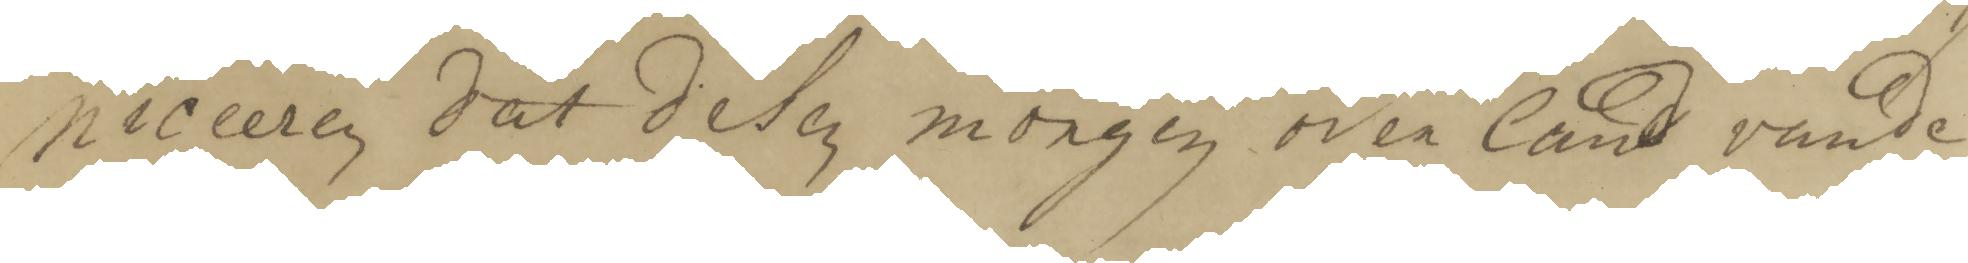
niceeren dat desen morgen over land vande
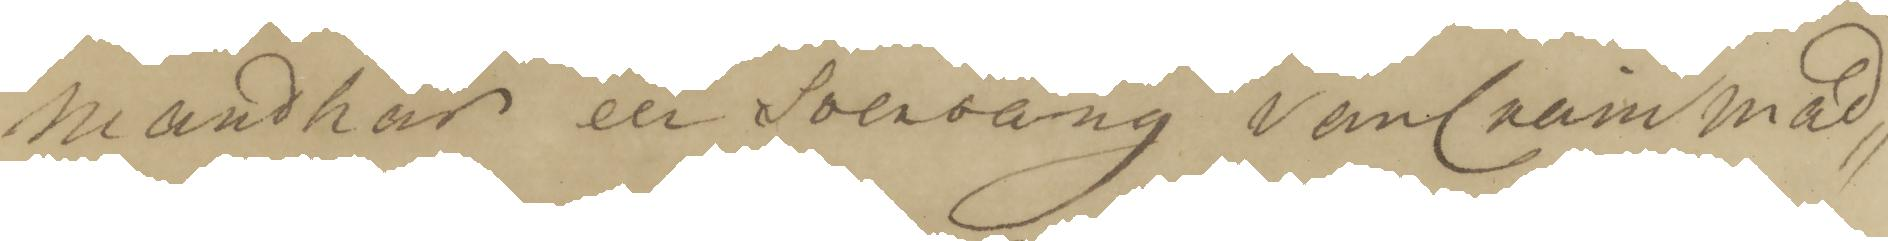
mandhar een soeroang van Crain mad„
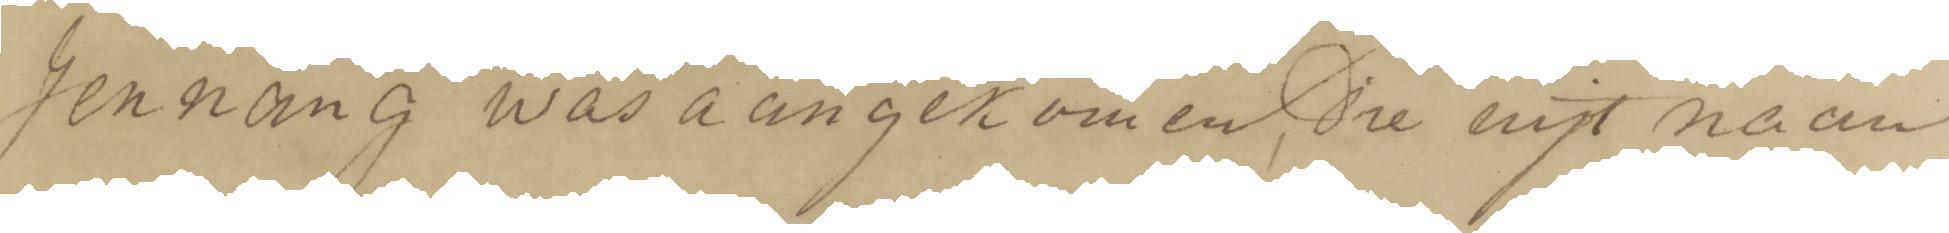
Jennang was aangekomen die uijt naam
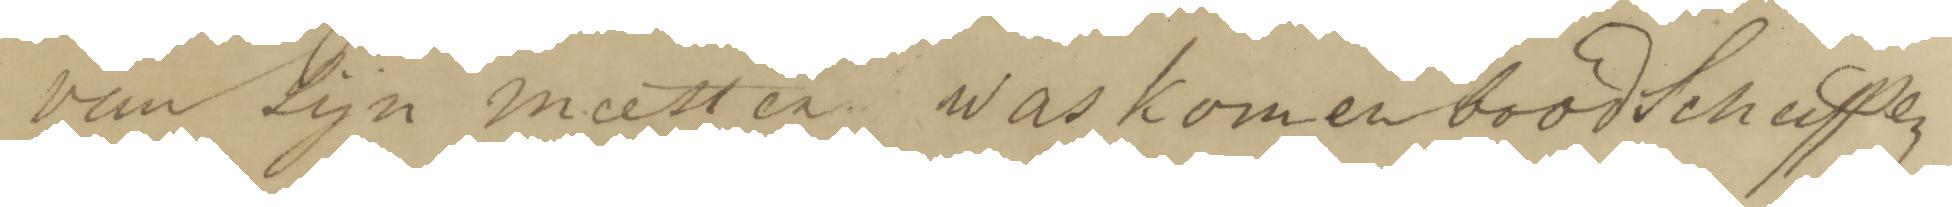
van zijn meester was komen boodschappen
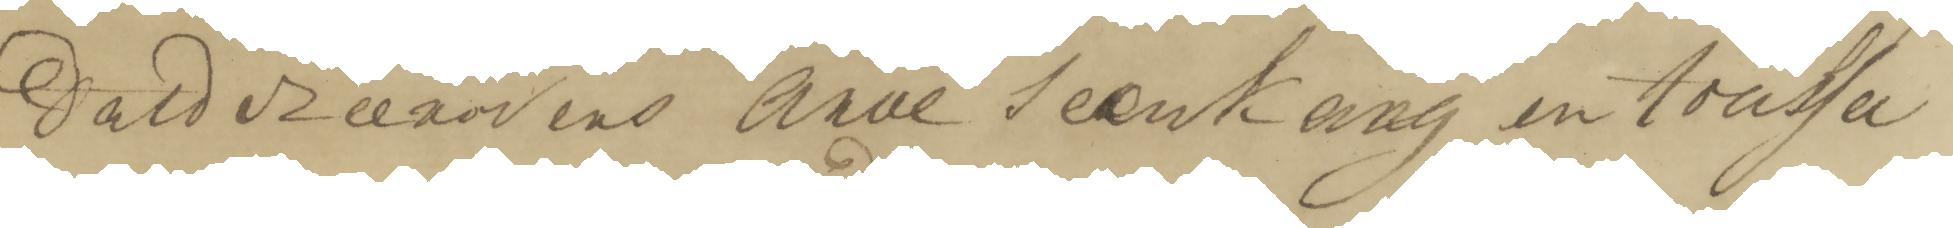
dat de zeerovers aroe seenkang en toassa
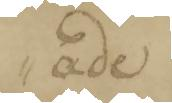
„ade
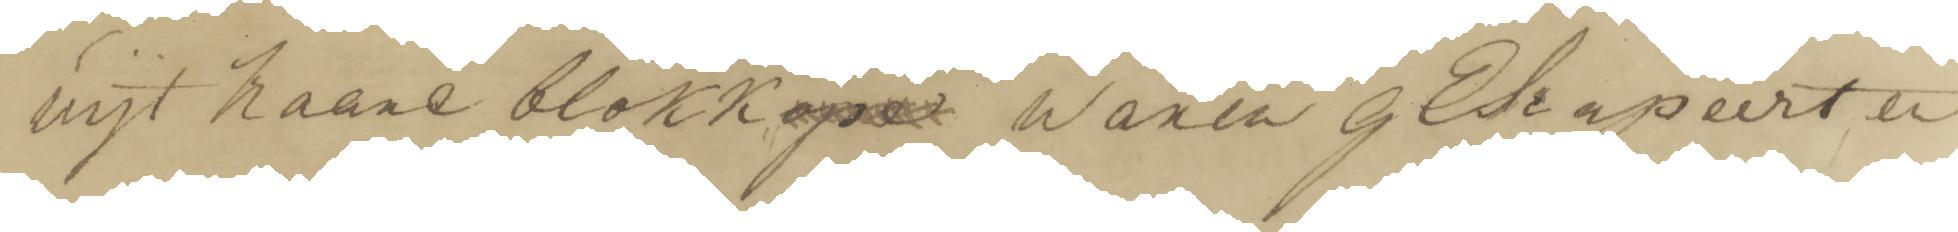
uijt haare blokk„ope waren gEscapeert, en
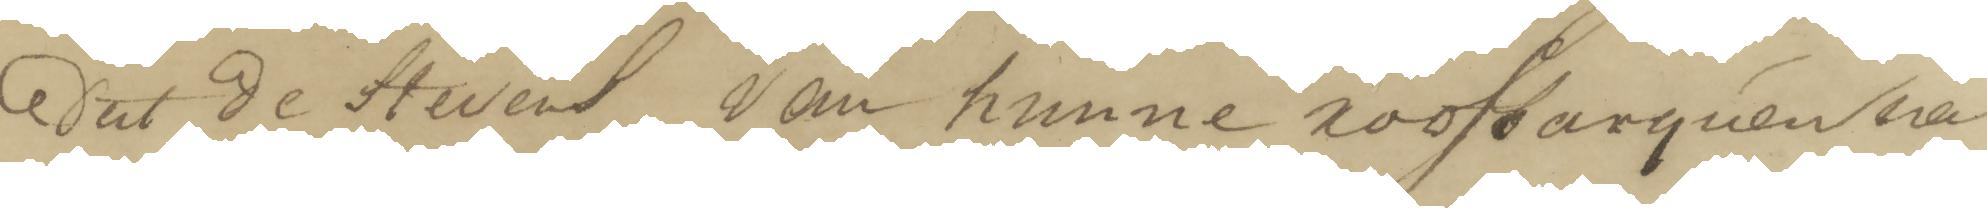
dat de stevers van hunne roofbarquen na
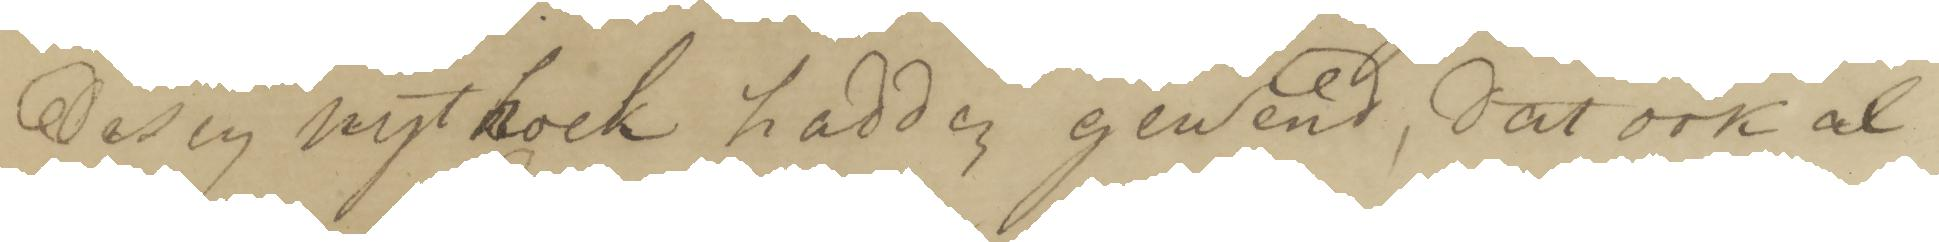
desen uythoek hadden gewend, dat ook al
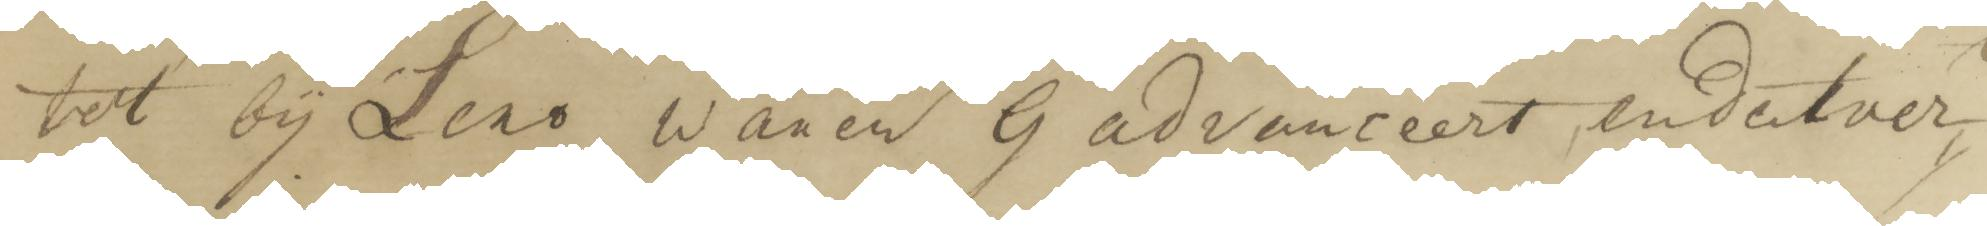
tot bij Lero waren G advanceert, en dat ver„
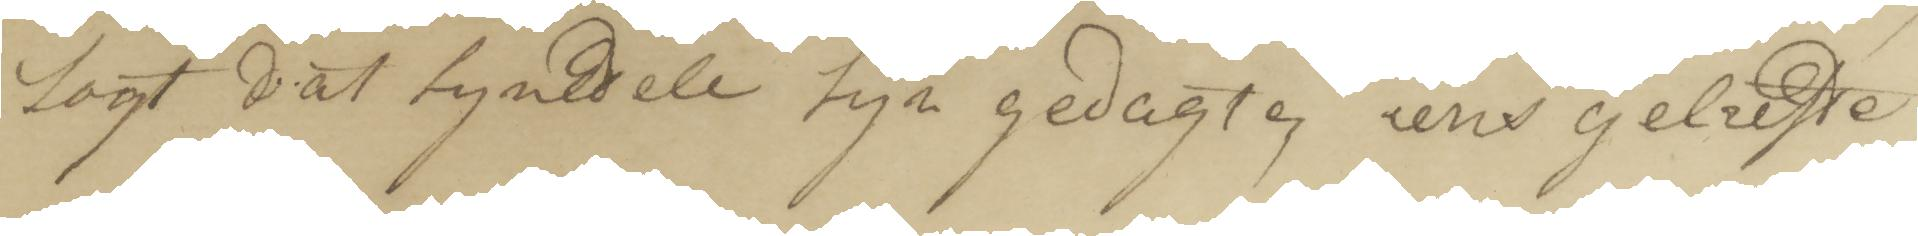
sogt dat syn Edele sijn gedagten eens geliefte
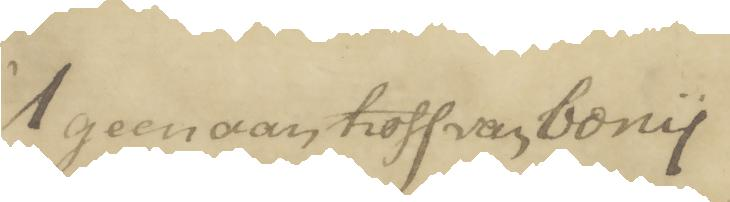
't geen aan hoff van bonij
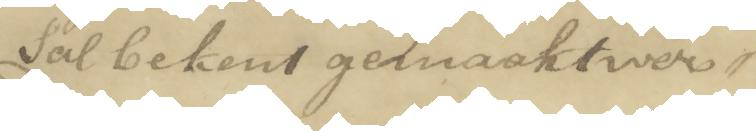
sal bekent gemaakt wer„
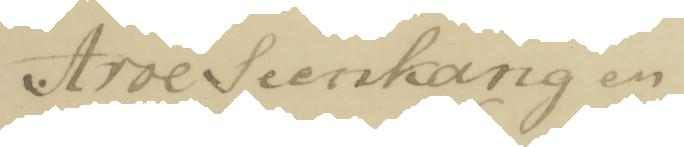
Aroe seenkang en
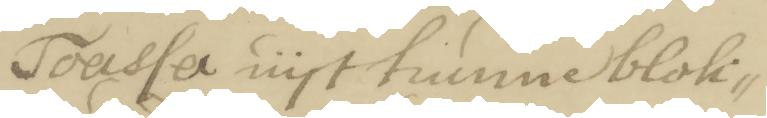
Toassa uijt hunne blok„
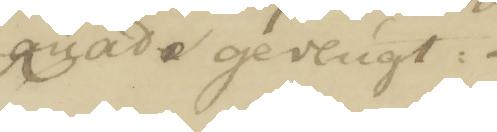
quade gevlugt:
